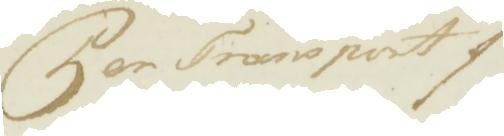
Per Transport ƒ
